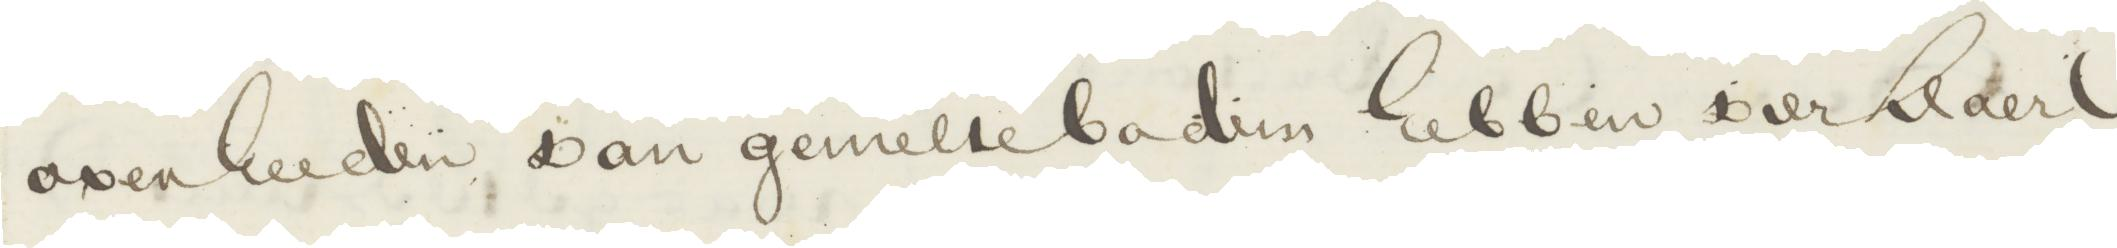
overheeden, dan gemelte bodem hebben verklaert
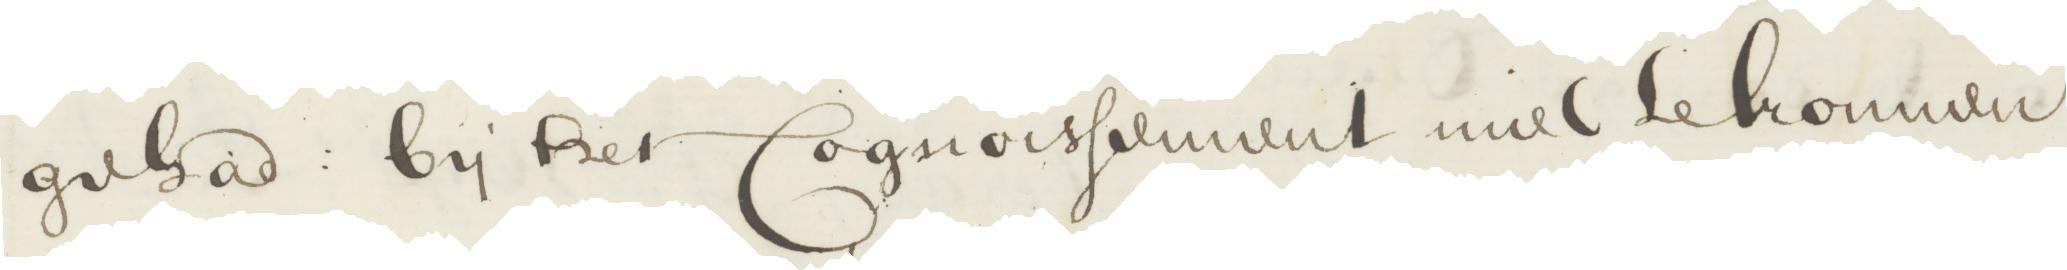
gehad: bij het cognoissement niet te konnen
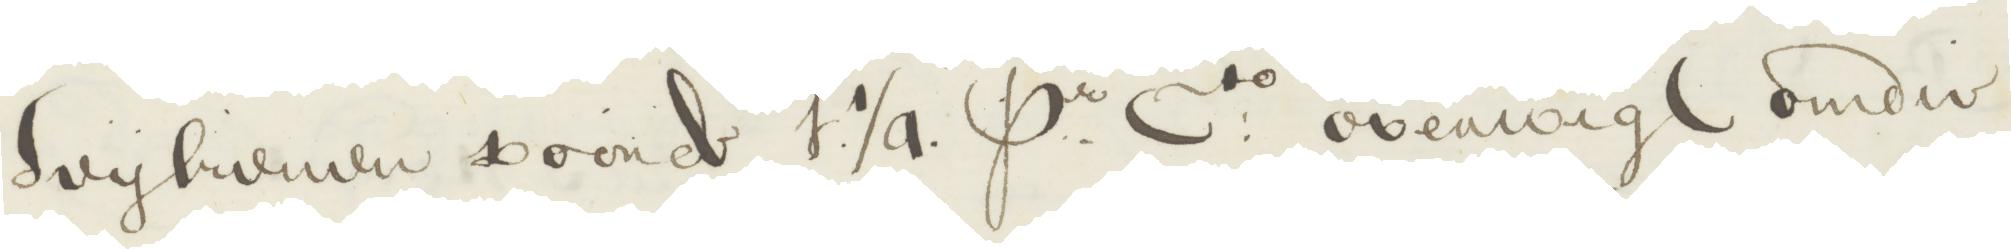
teijkenen voor de 1. 1/4. P:r C:to overwigt omdie
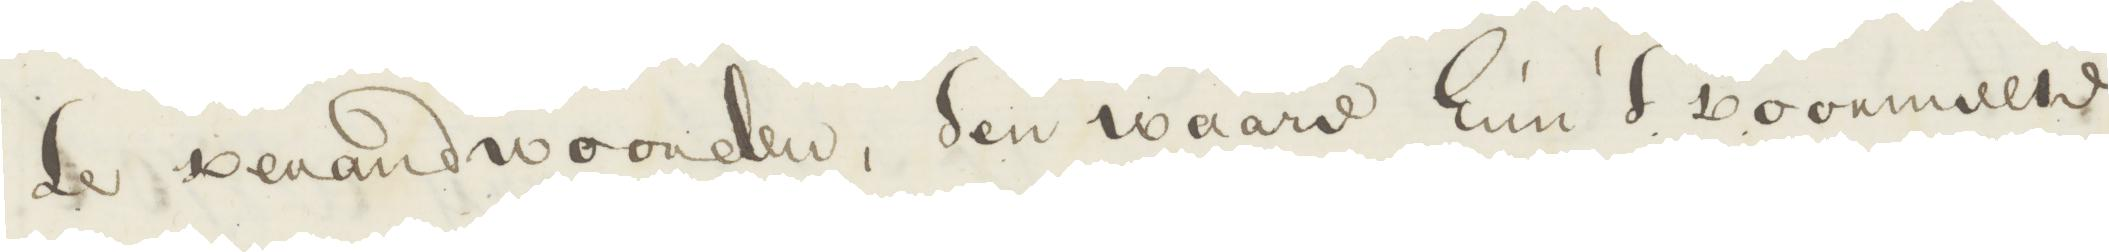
te verandwoorden, ten waare hun 't voormelte
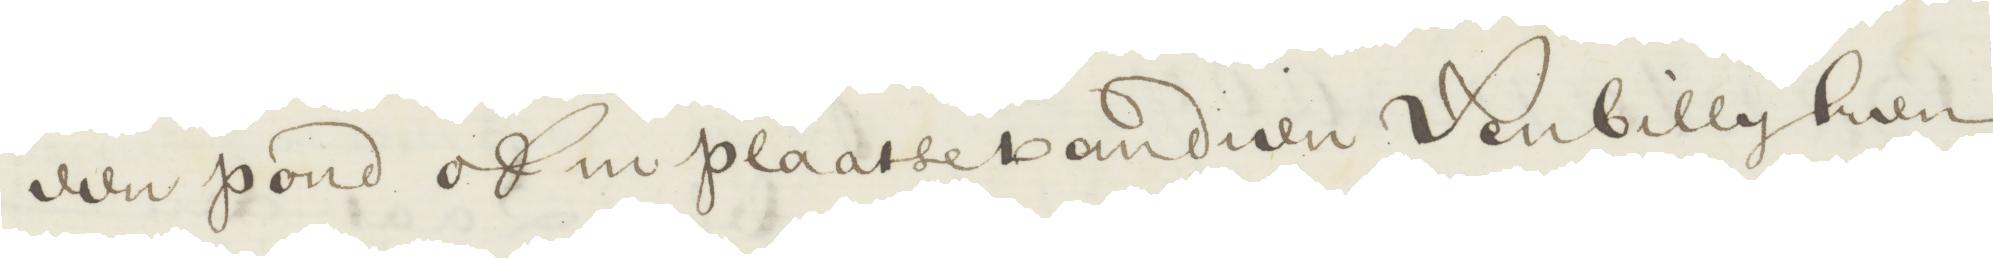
een pond of in plaatse van dien Een billijken
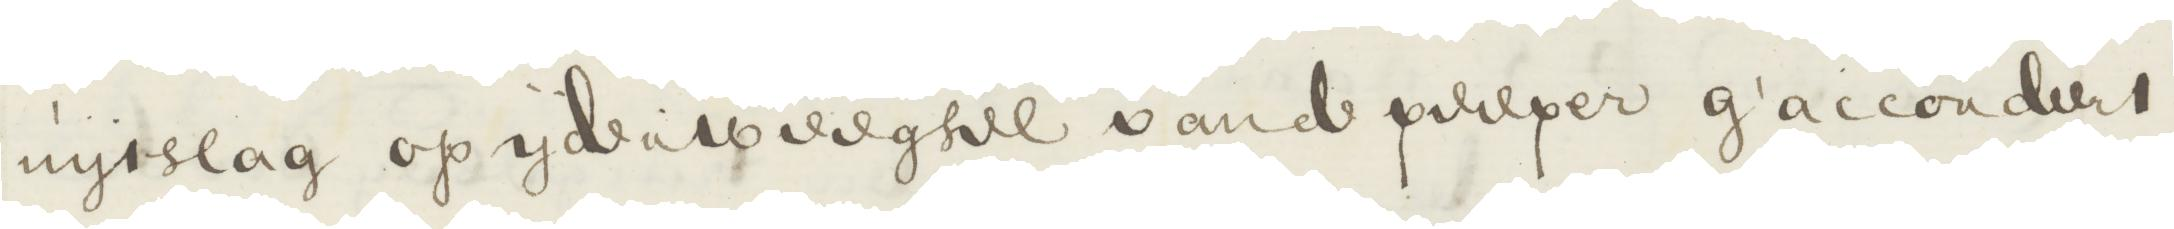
uijtslag op ijder weegsel van de peeper g’accordeert
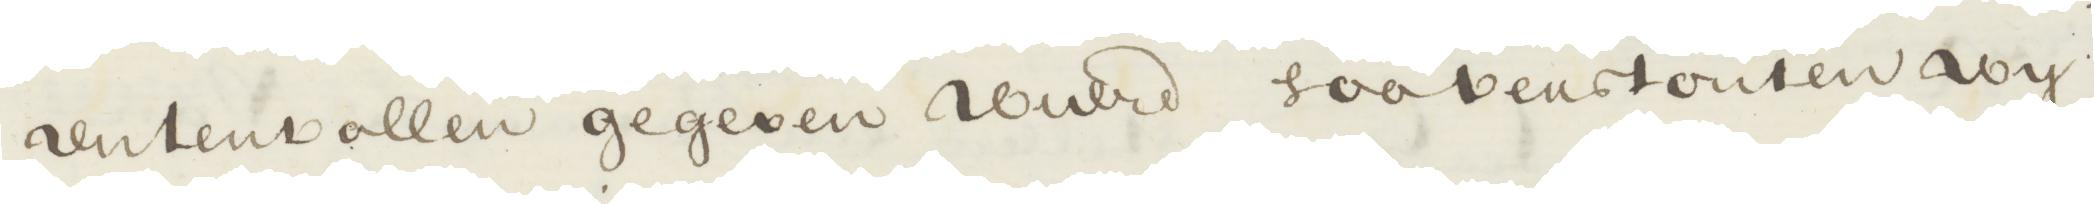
en ten vollen gegeven wierd soo verstouten wij
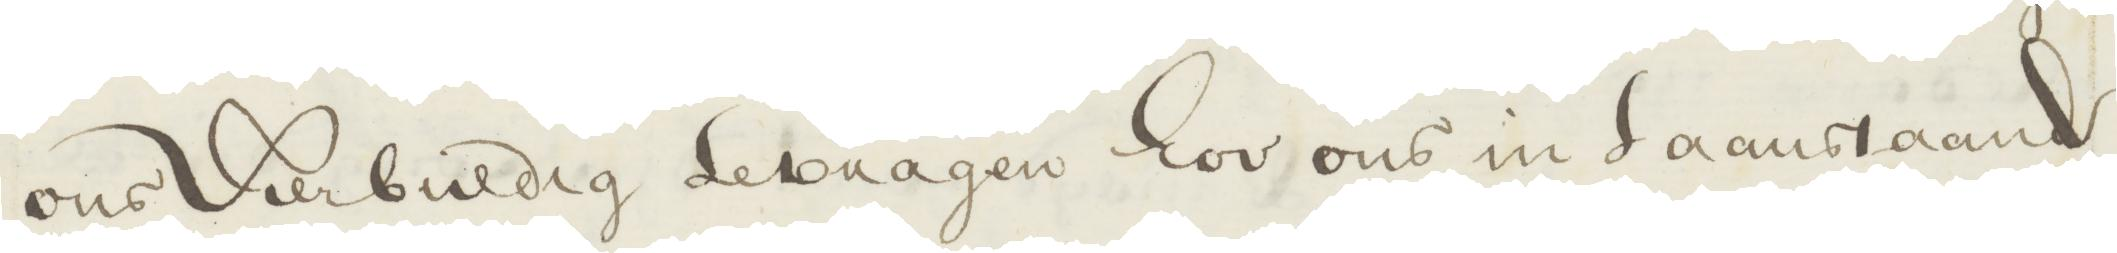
ons Eerbiedig te vragen hoe ons in 't aanstaande
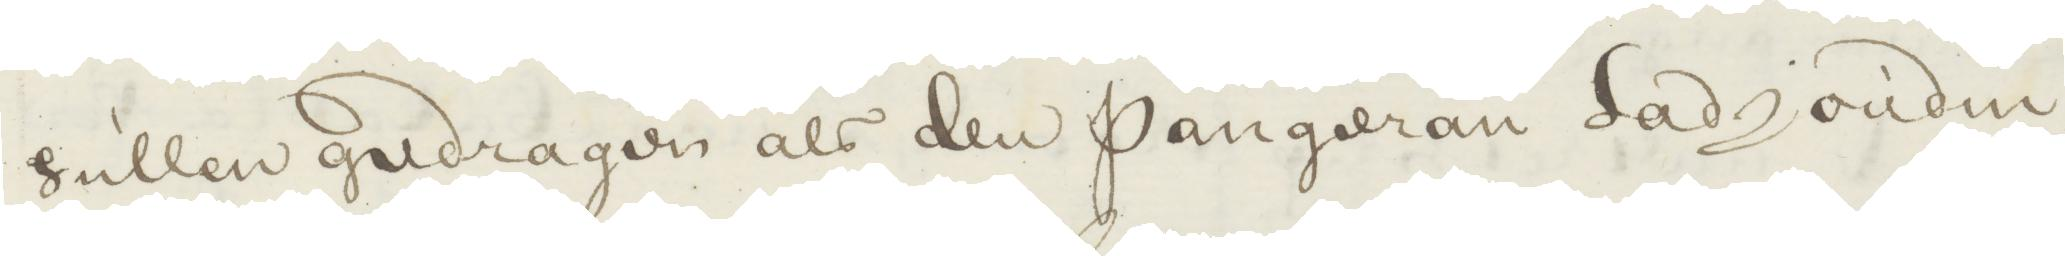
sullen gedragen als den pangeran tadjoudin
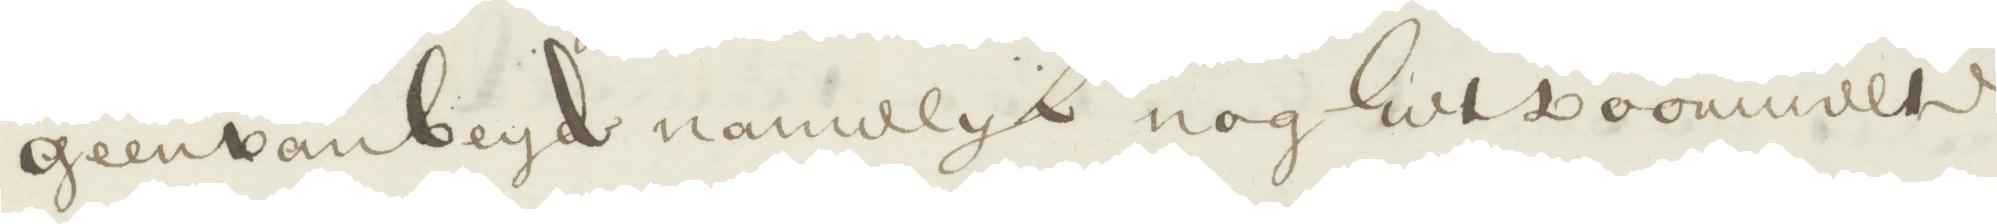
geen van beyde namelijk nog het voormelte
